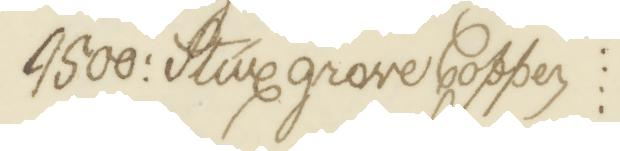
4500: Stux grove Coppen:
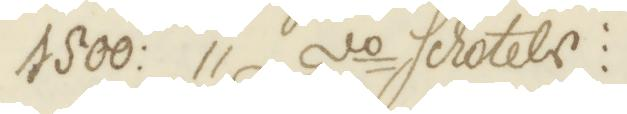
1500: „ d=o schotels
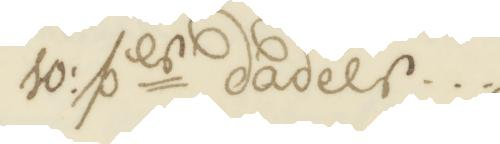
10: p=ls dadels . . . .
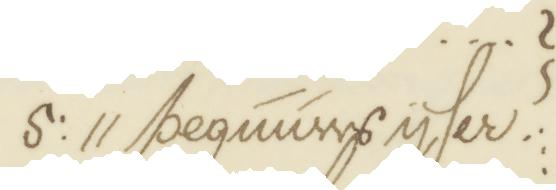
5: „ peguuws ijser
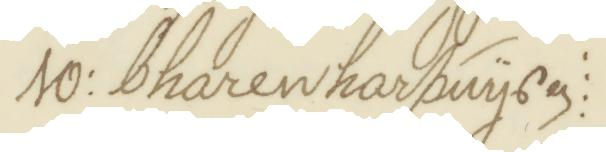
10: bharen harpuijs en
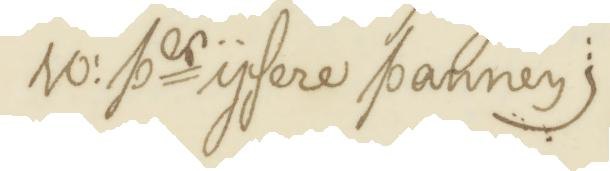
10: p=ls ijsere pannen
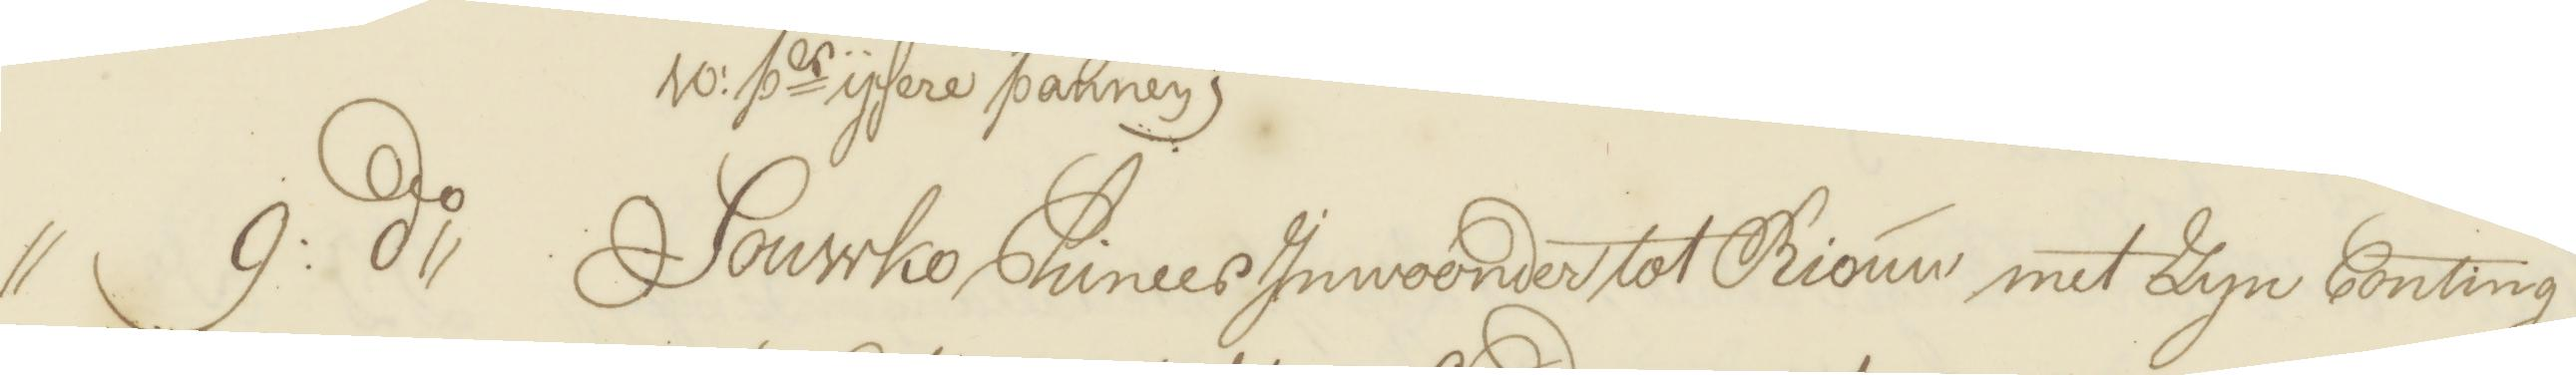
„ 9: d„o Souwko Chinees Jnwoonder tot Riouw met zyn Conting
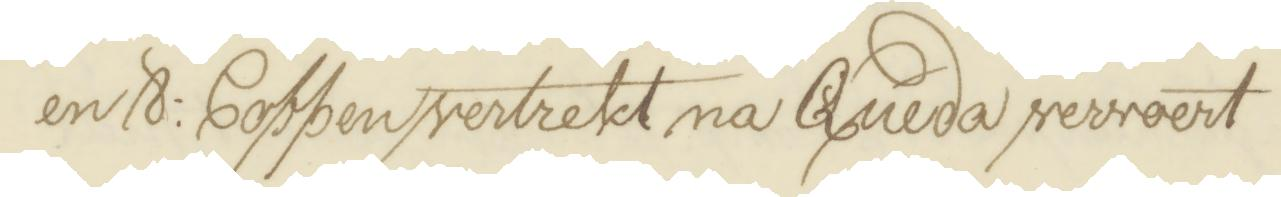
en 8: Coppen vertrekt na Queda vervoert
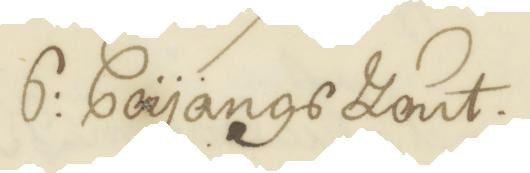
6: Coijangs zout.
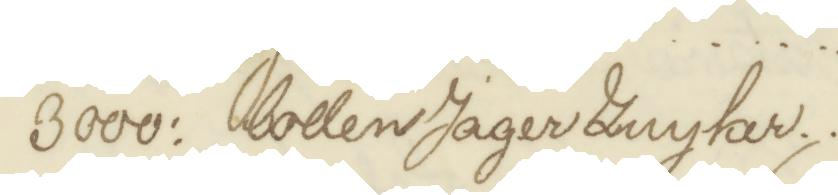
3000: bollen Jager Zuyker.
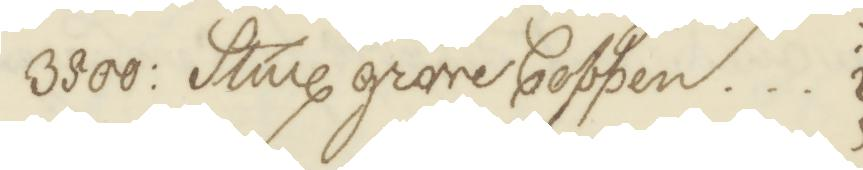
3500: Stux grove Coppen . . .
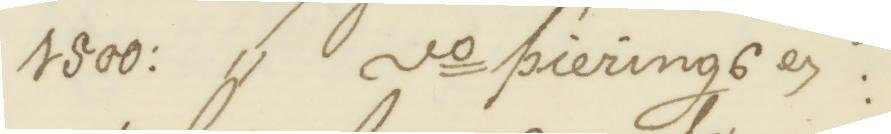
1500: „ d=o pierings en .
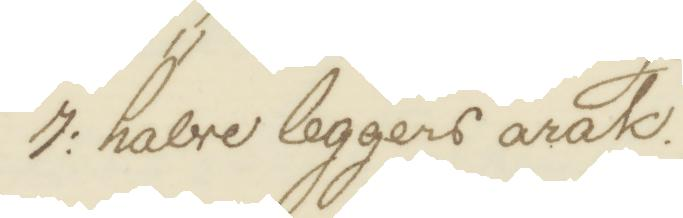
7: halve leggers arak
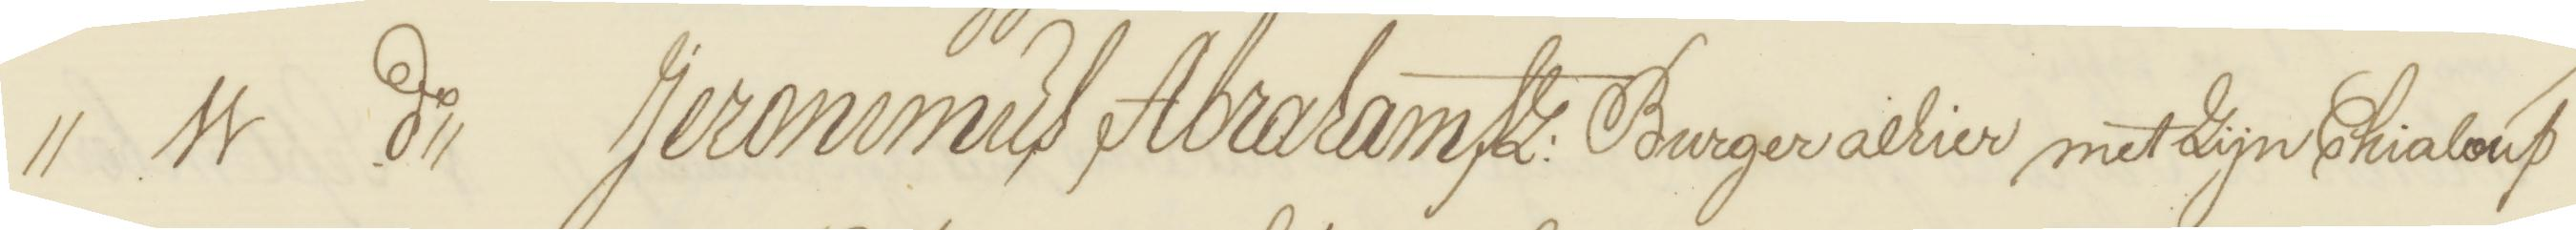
„ W d„o Jeronimus Abrahamsz: Burger alhier met zijn Chialoup
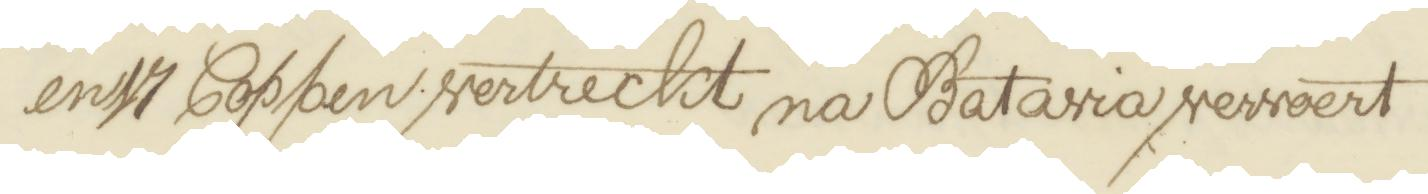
en 17 Coppen vertreckt na Batavia vervoert
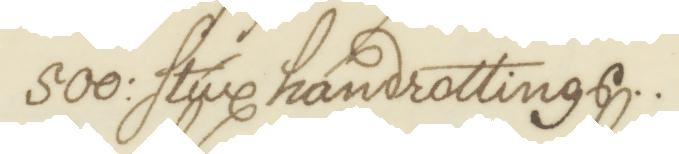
500: stux handrottings ..
